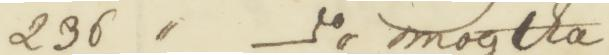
236 „ D„o mogtha
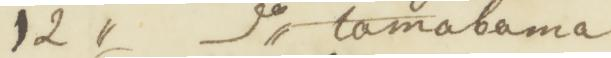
12 „ D„o tamabama
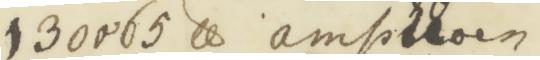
130065 lb amphioen
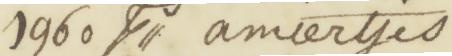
1960 p„s amiertjes
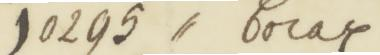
10295 „ borax
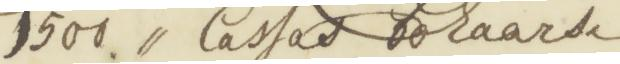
1500 „ Cassas bohaarse
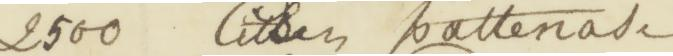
2500 Citsen pattenase
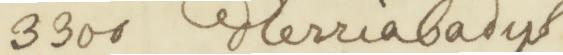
3300 dherriabadijs
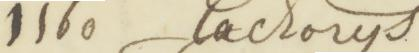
1160 lachorijs
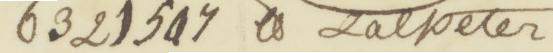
6321547 lb zalpeter
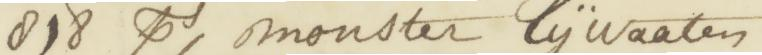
818 p„s monster lijwaaten
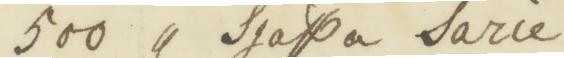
500 „ Sjaffa sarie
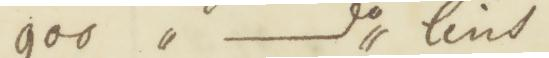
900 „ D„o lins
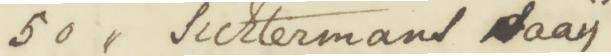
50 „ Sichtermans saaij
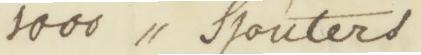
1000 „ sjouters
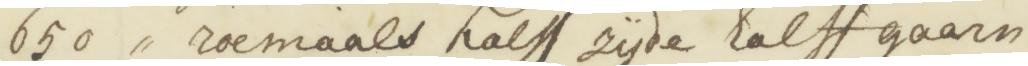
650 „ roemaals halff zijde halff gaarn
